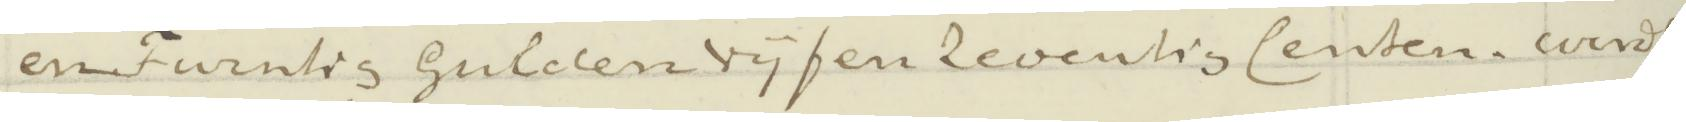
en Twintig Gulden vijf en Zeventig Centen. wordt
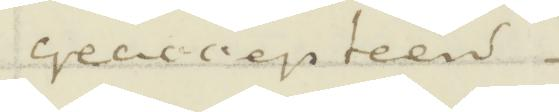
geaccepteerd
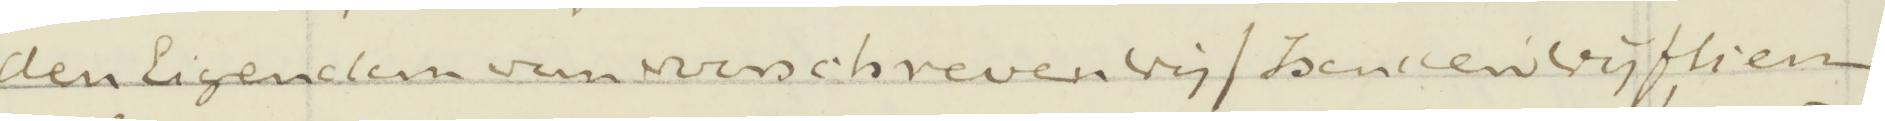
den Eigendom van voorschreven vijf honderd vijftien
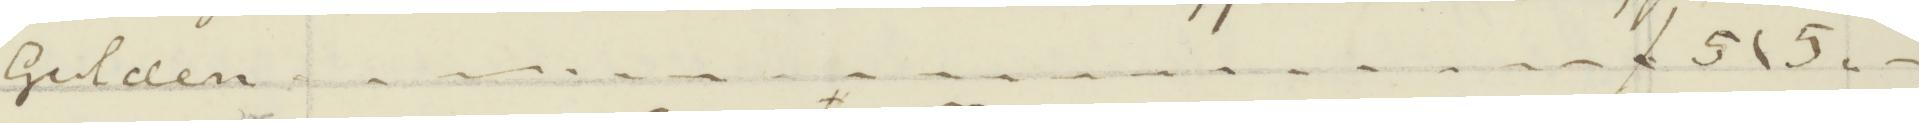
Gulden - - - - - - - - - - - - - - - - - - - ƒ 515 „ —
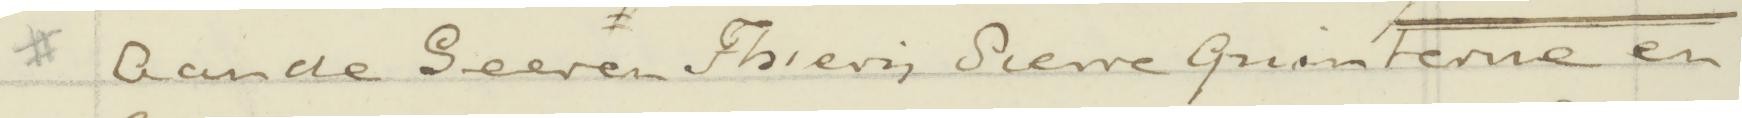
# aan de Heeren Thierij Pierre Quinterne en
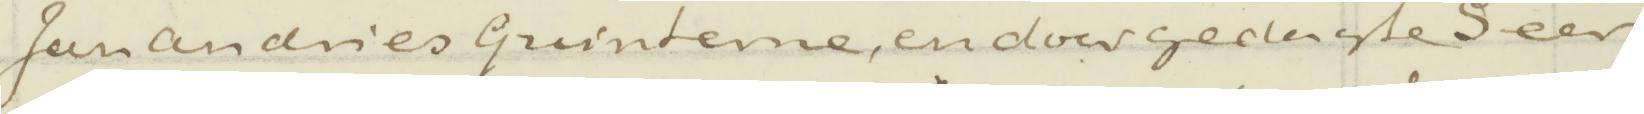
Jan andries Quinterne, en door gedagte heer
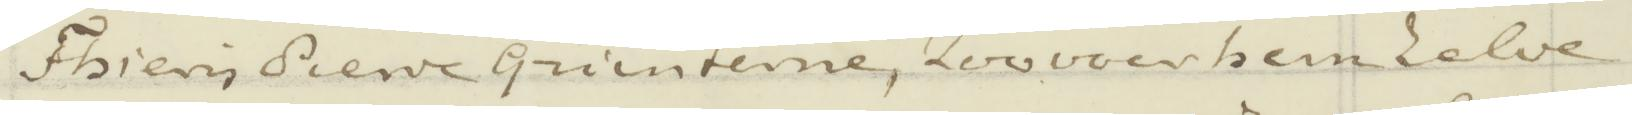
Thierij Pierre Quinterne, zoo voor hem zelve
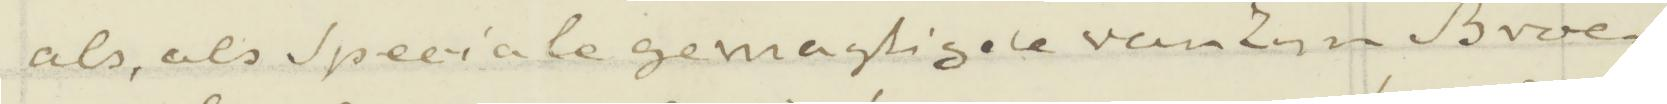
als, als speciale gemagtigde van zijn Broe=
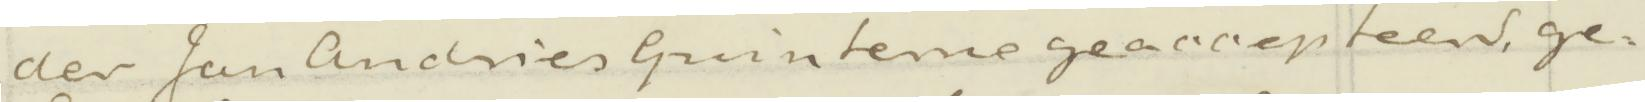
der Jan Andries Quinterne geaccepteerd, ge=
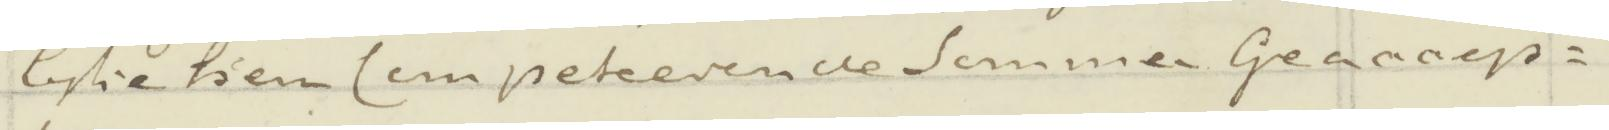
lyke hem Competeerende Somma Geaccep=
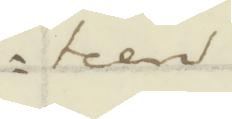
=teerd
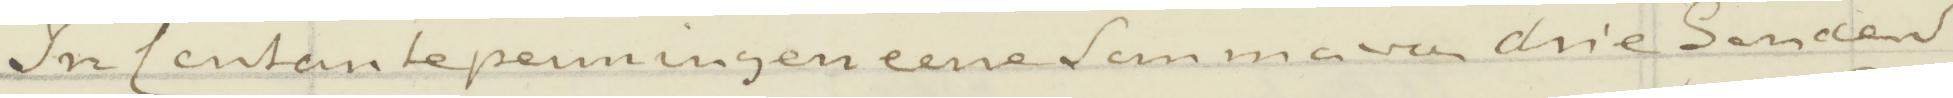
In Contante penningen eene somma van drie honderd
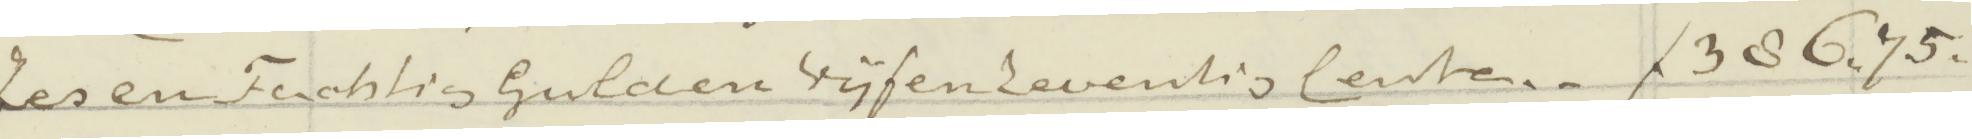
Zes en Tachtig Gulden vijfen Zeventig Centen . - ƒ386„75„
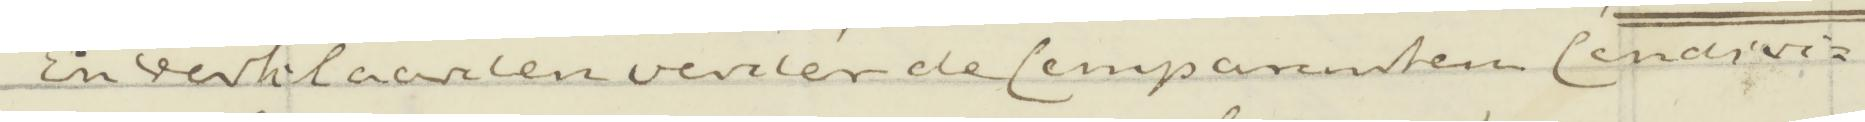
En verklaarden verder de Comparanten Condivi=
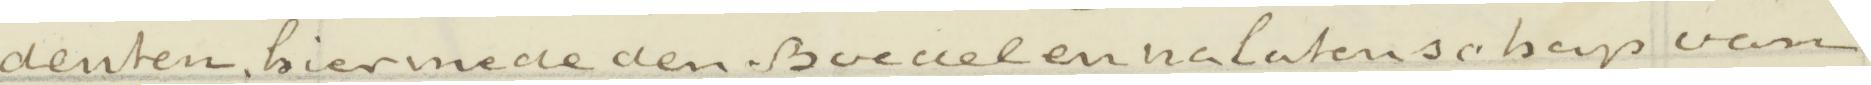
denten, hier mede den Boedel en nalatenschap van
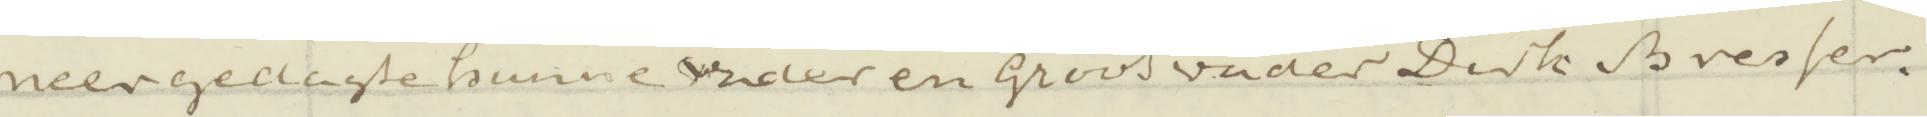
meer gedagte hunne vader en Groot vader Dirk Bresser,
